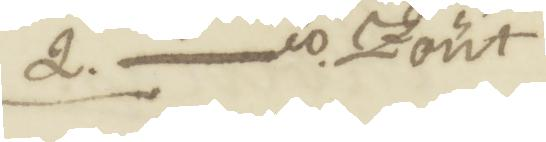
2. _.o Zout
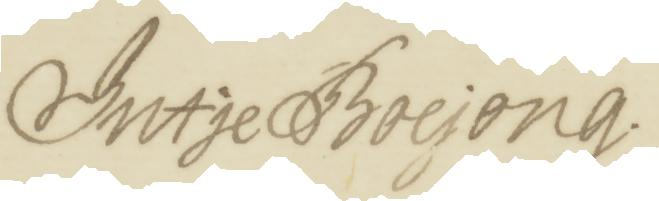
Intje Boejong.
